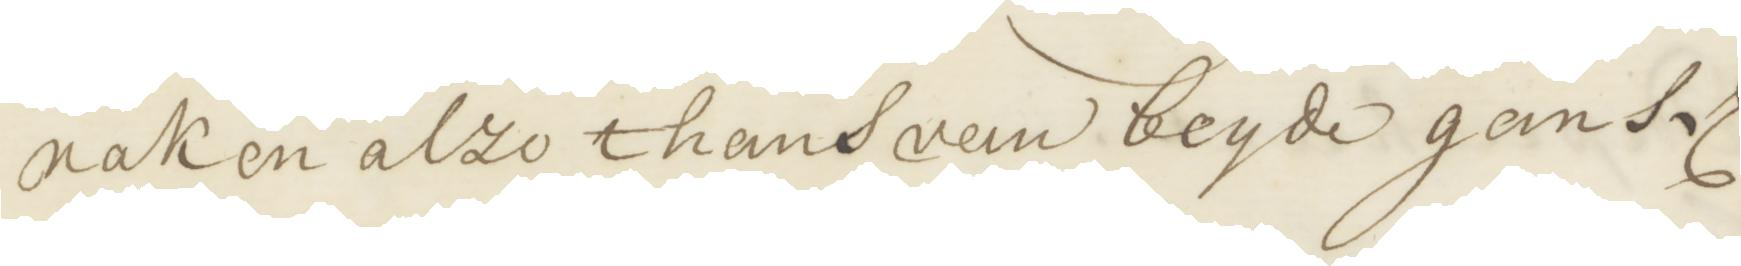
raken alzo thans van beyde gansch
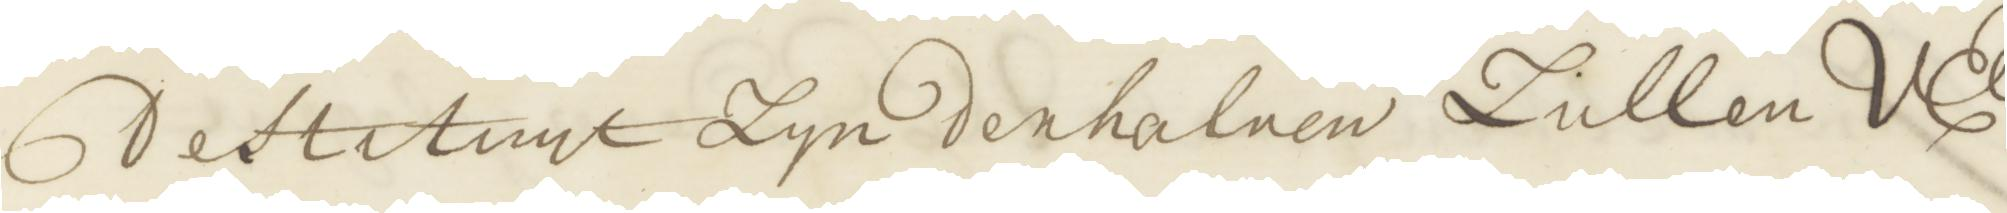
destituyt zyn derhalven zullen VE
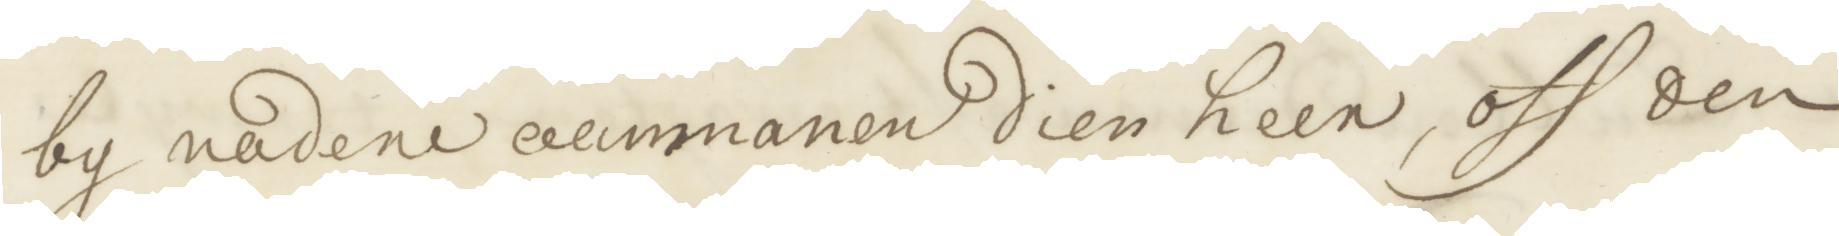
bij nadere aanmanen dien heer, off den
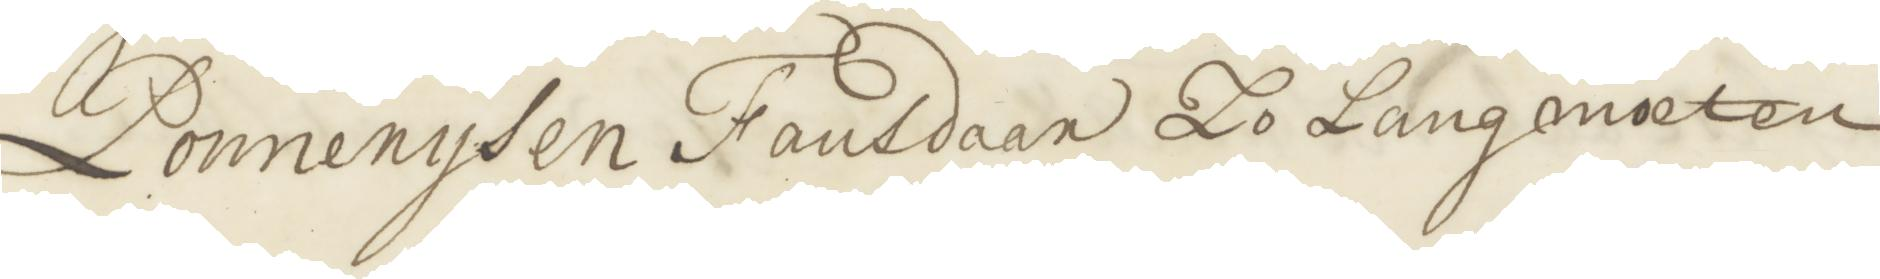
Ponnerijsen Fausdaar zo lang moeten
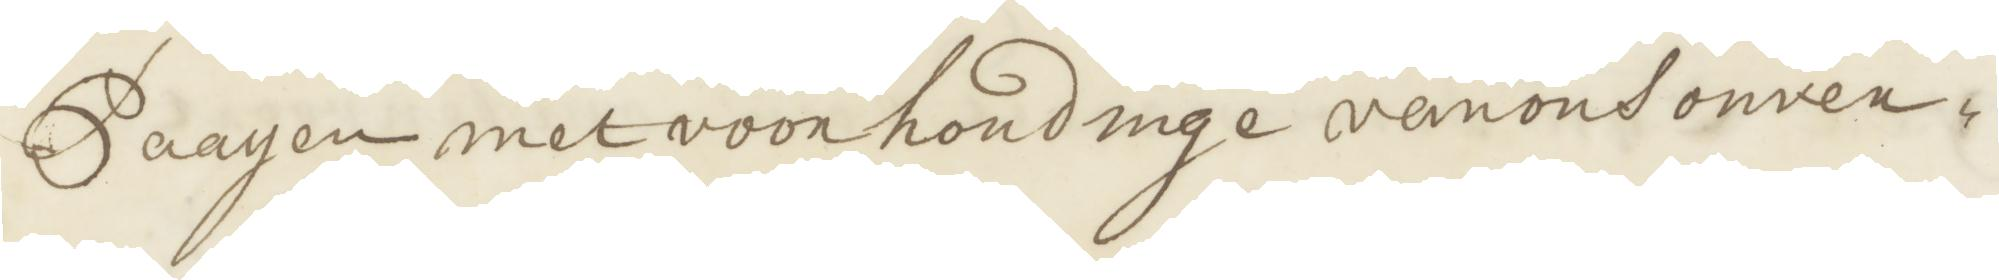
Paaijen met voor houdinge vanons onver„
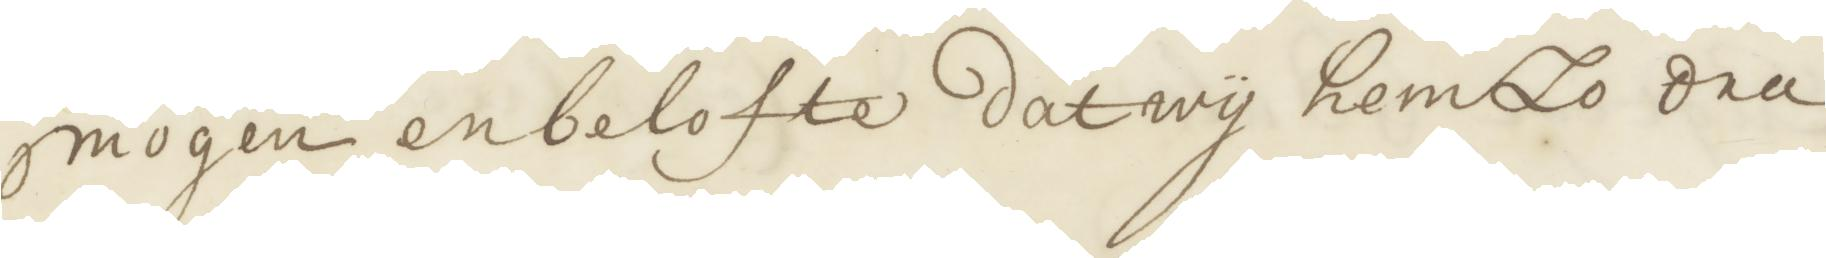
mogen enbelofte dat wij hemzo dra
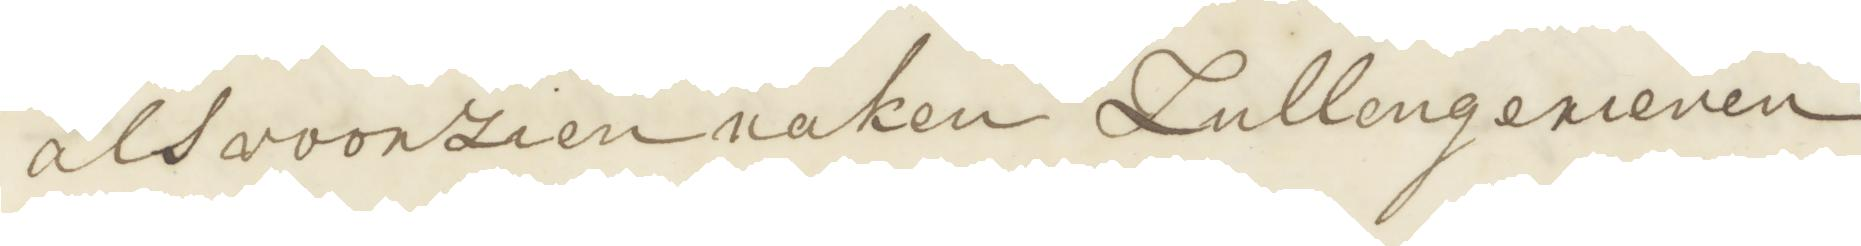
als voorzien raken zullengerieven
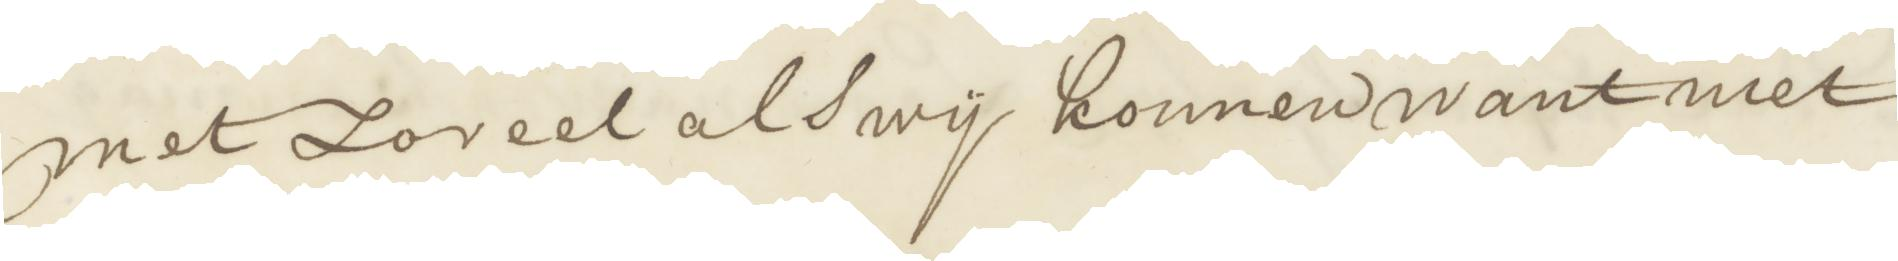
metzoveel als wij konnen want niet
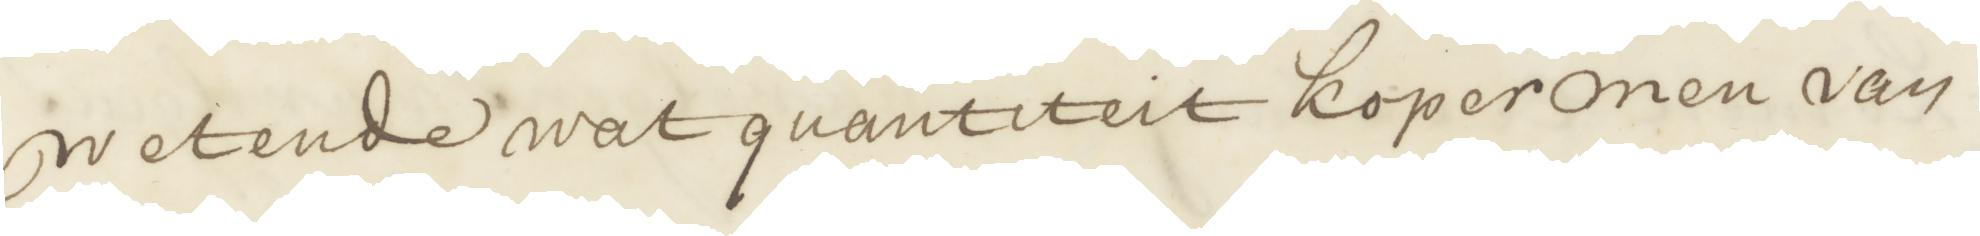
wetende wat quantiteit koper men van
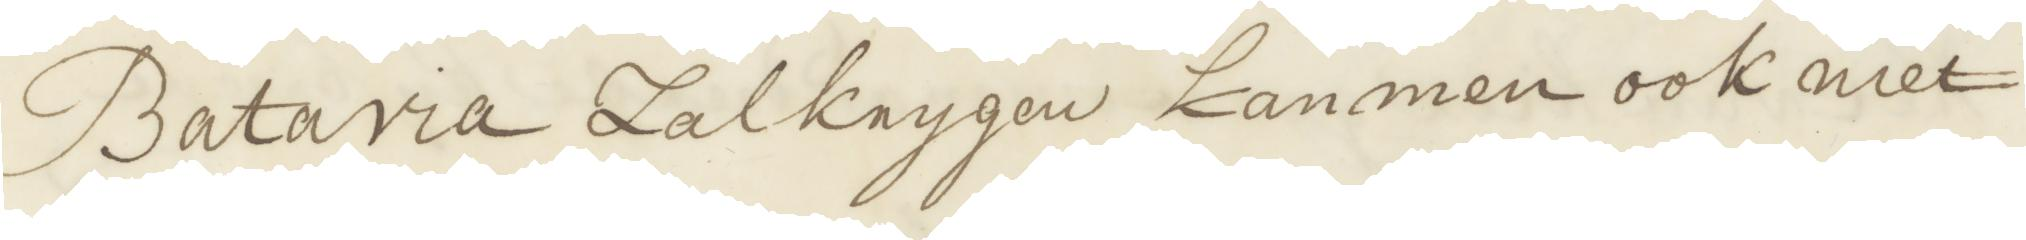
Batavia zal krijgen kan men ook niet
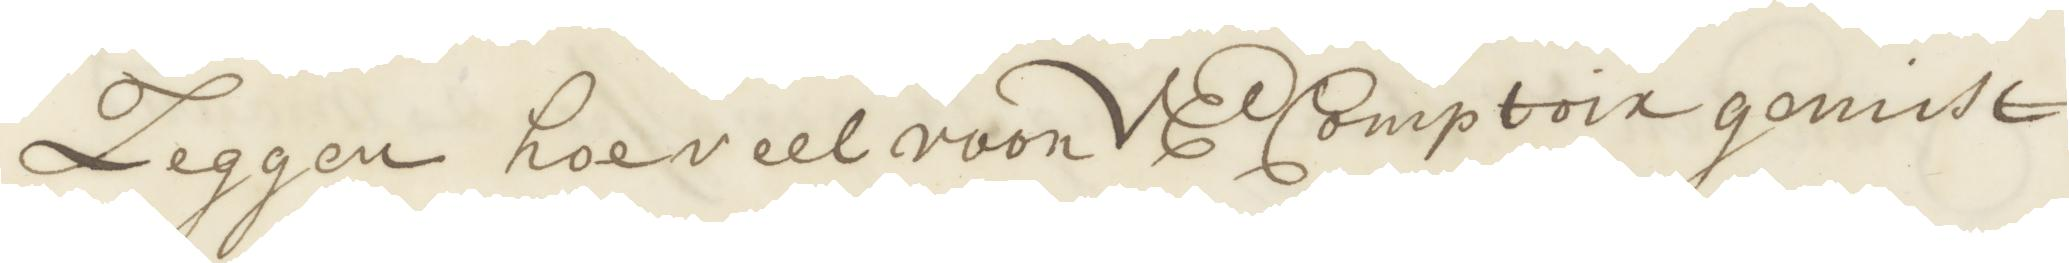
zeggen hoe veel voor VE Comptoir gemist
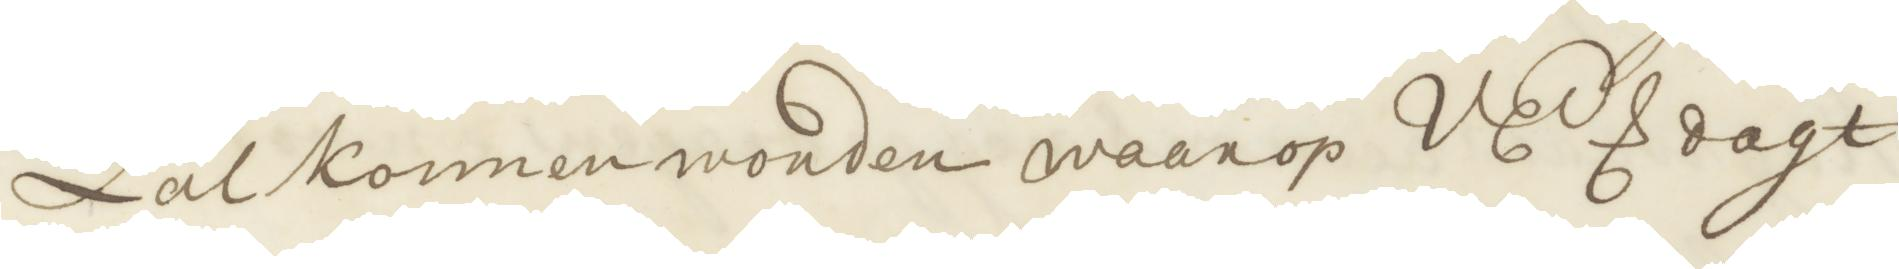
zal konnen worden waarop VE verdagt
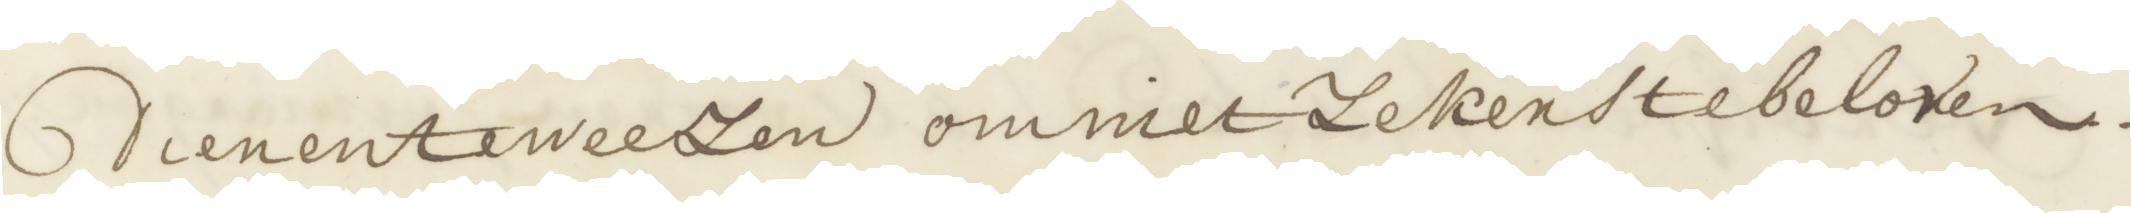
dienenteweezen om niet zekers tebeloven
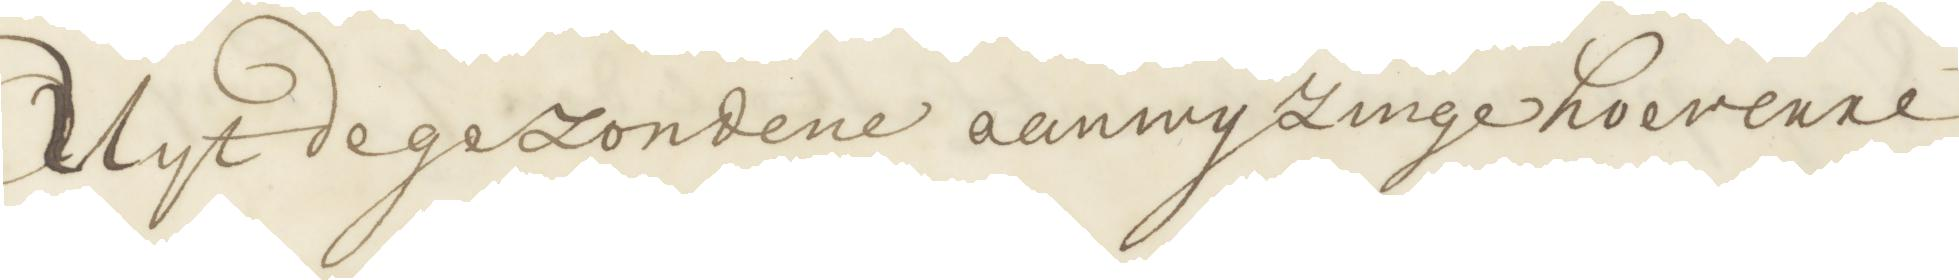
Uyt degezondene aanwyzinge hoeverre
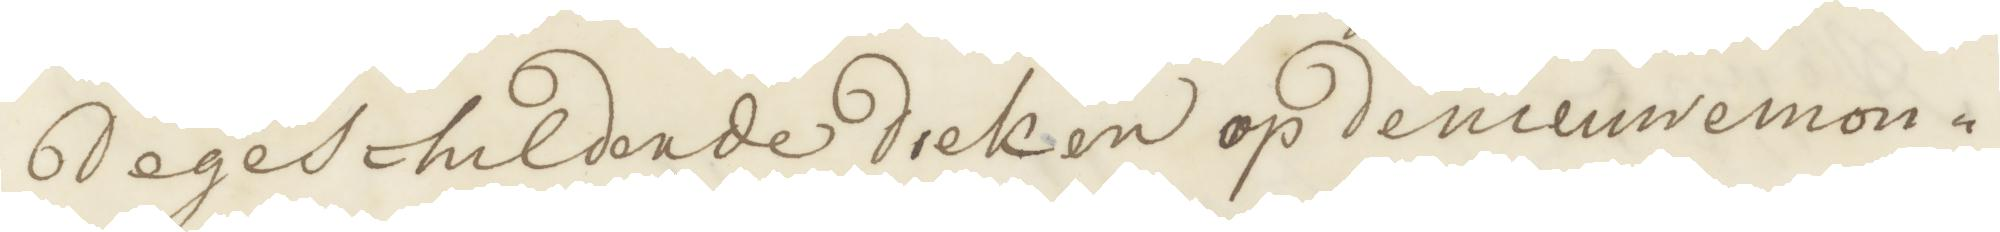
degeschilderde doeken op de nieuwemon„
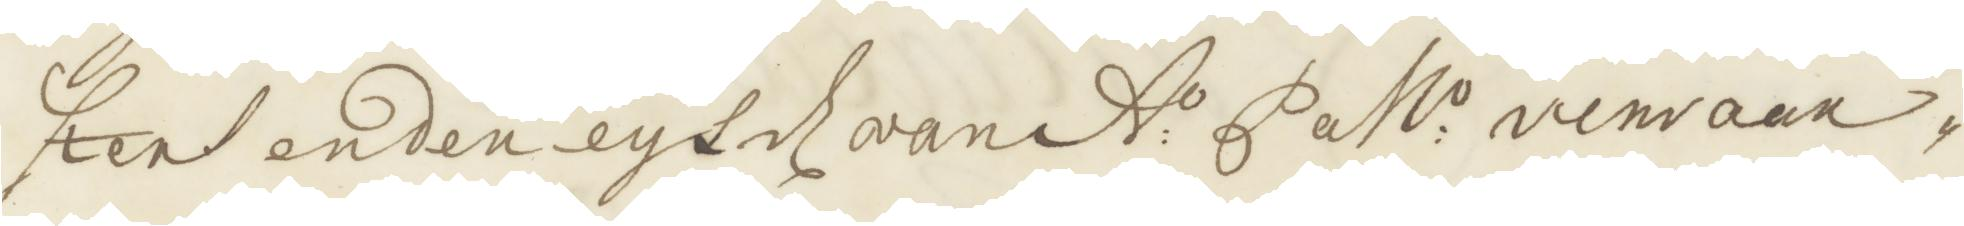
ster enden eysch van A:o Pass:o vervaar„
